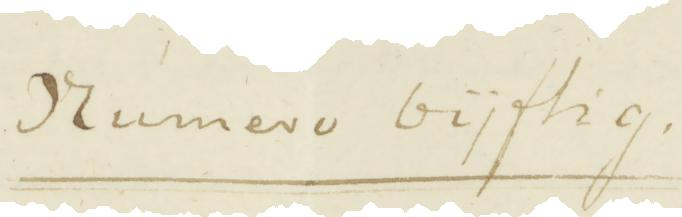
Numero vijftig,
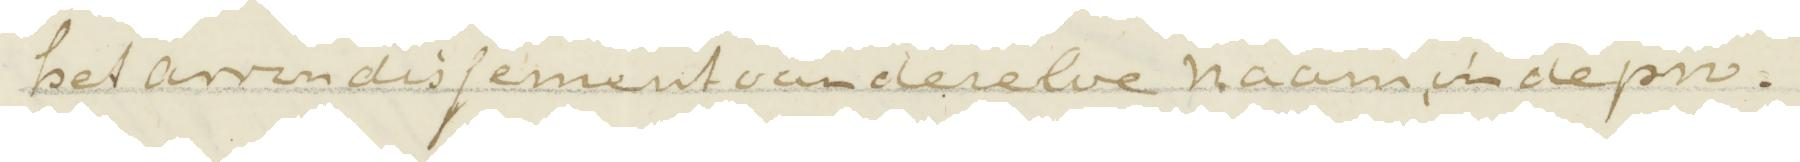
het arrondissement van dezelve naam, in de pro=
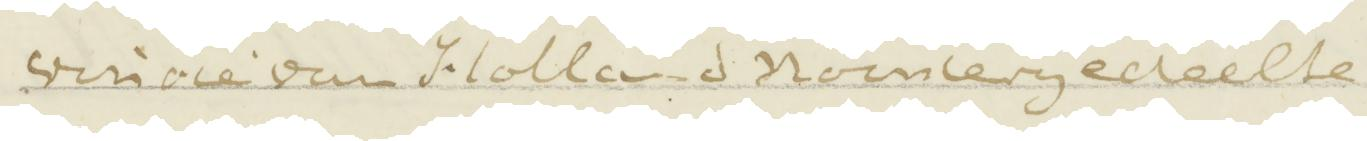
vincie van Holland Noordergedeelte
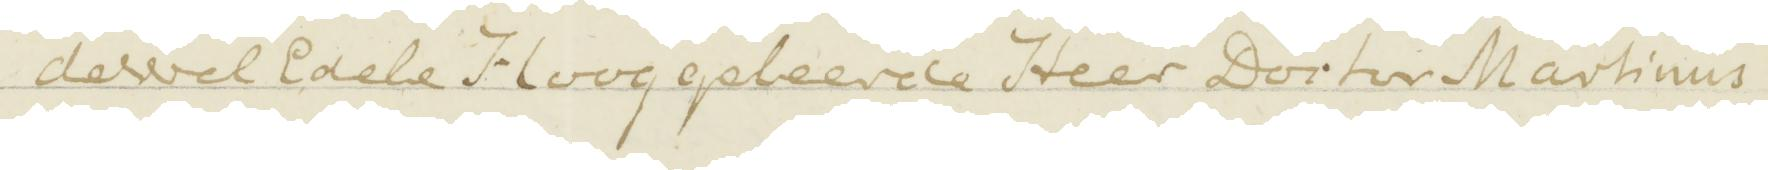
de wel Edele Hoog geleerde Heer Doctor Martinus
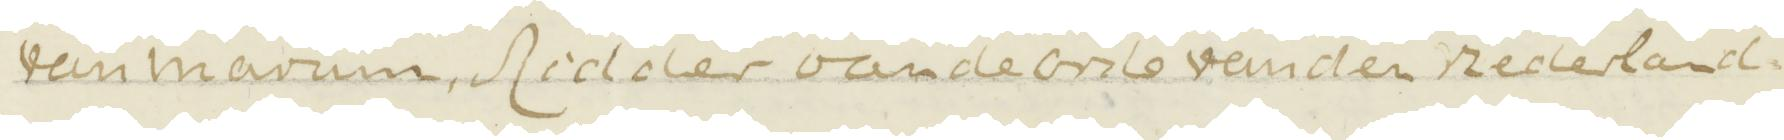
van marum, Ridder van de orde van den Nederland=
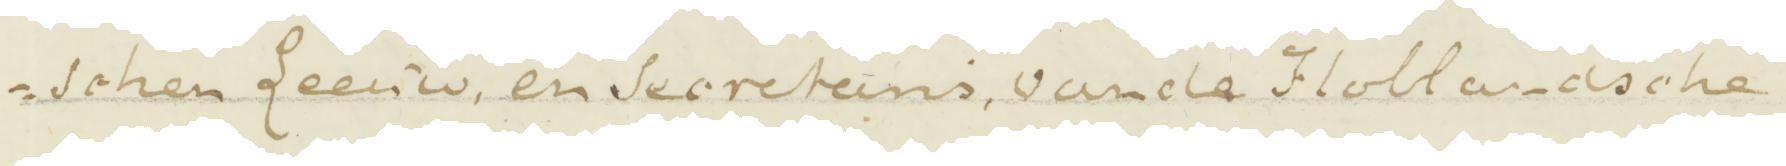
=schen Leeuw, en Secretais, van de Hollandsche
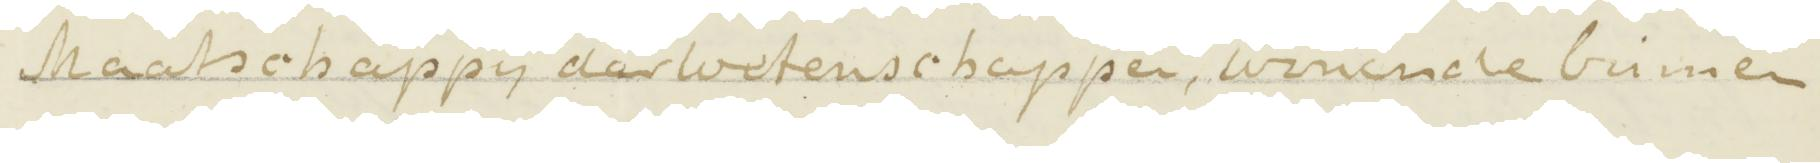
Maatschappij der wetenschappen, wonende binnen
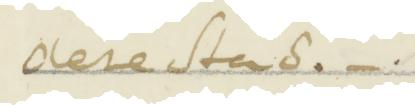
deze Stad.
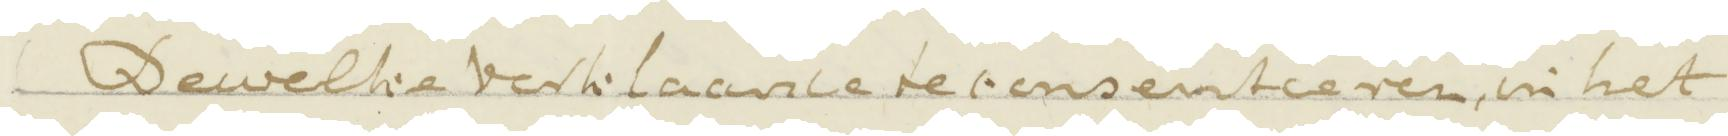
Dewelke verklaarde te consenteeren, in het
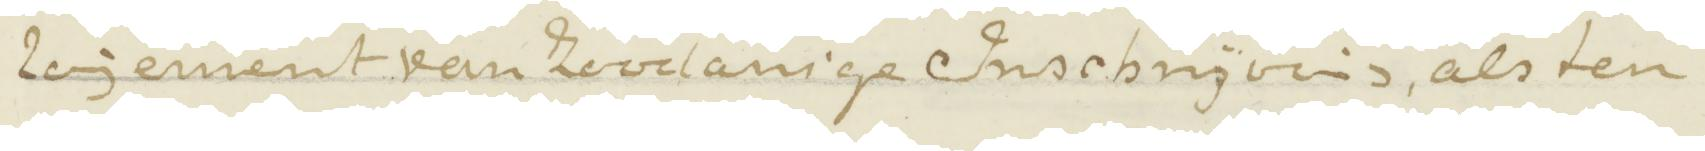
roijement van zoodanige Jnschrijvens, als ten
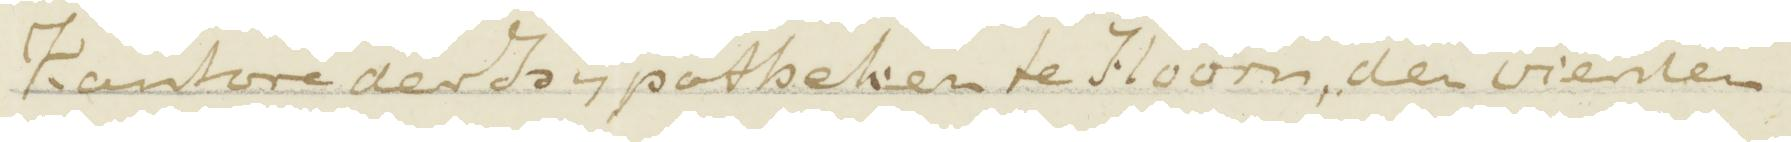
Kantore der hijpotheken te Hoorn, den vierden
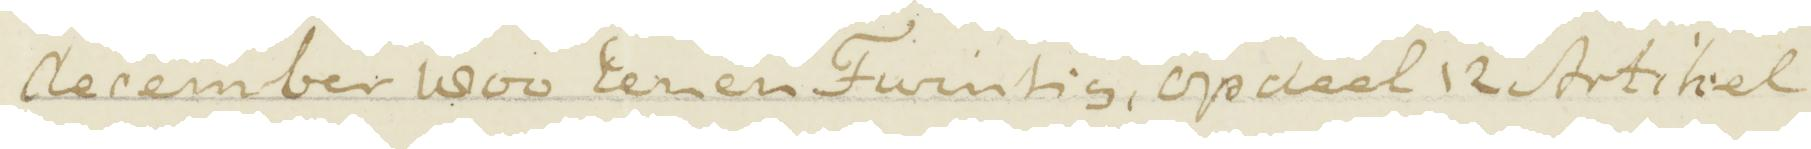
december 1800 Een en Twintig, op deel 12 Artikel
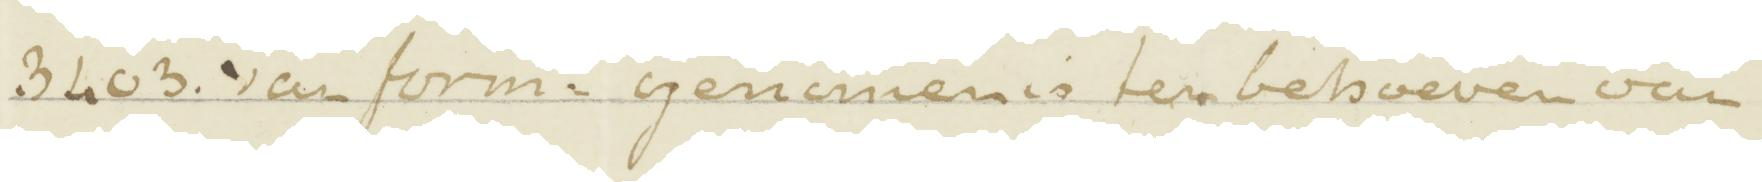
3403. van form=t genomen is ten behoeven van
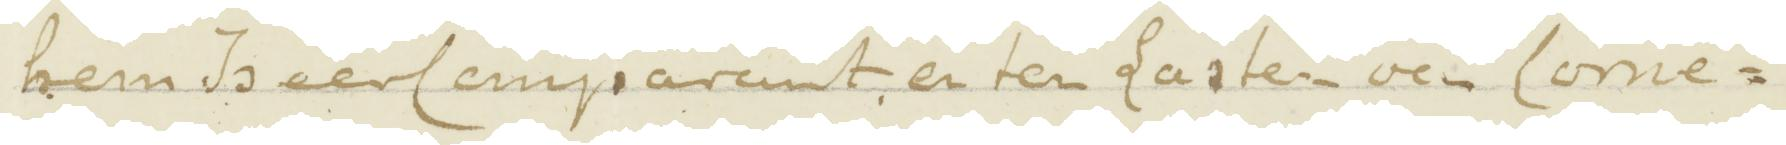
hem heer Comparant, en ten Lasten van Corne=
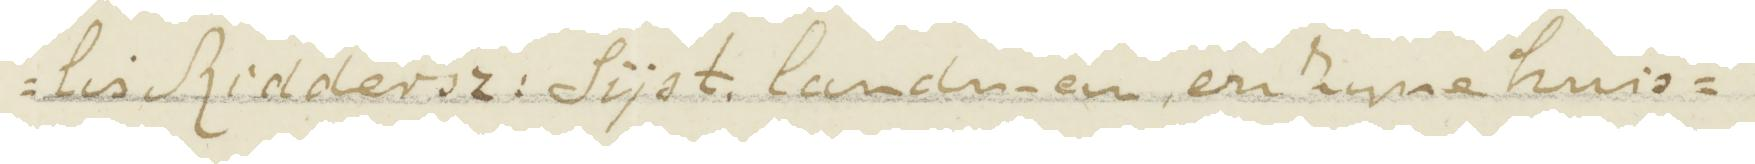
=lis Riddersz: Sijst, landman, en zyne huis=
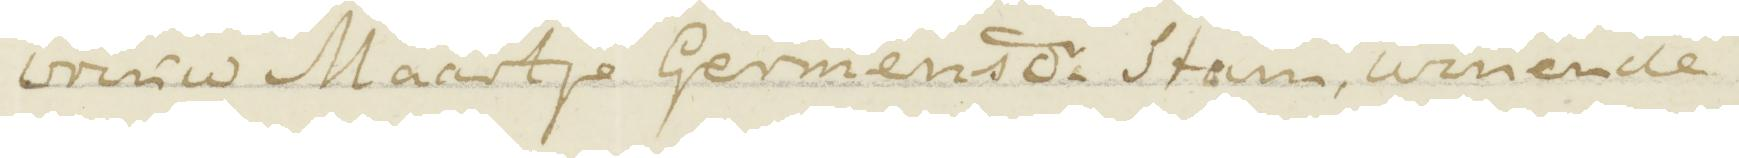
vrouw Maartje Germensd-r Stam, wonende
